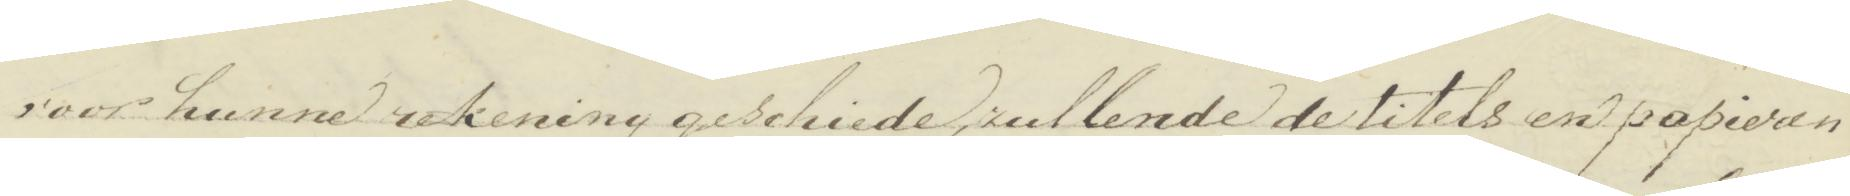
voor hunne rekening geschiede, zullende de titels en papieren
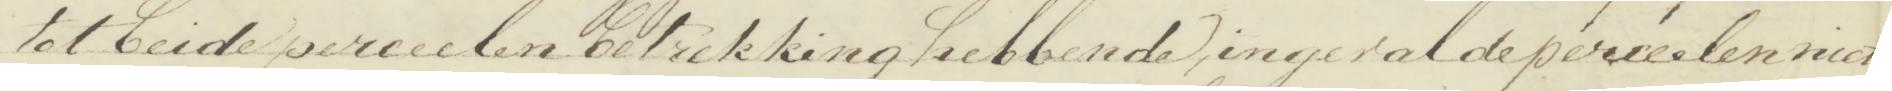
tot beide perceelen betrekking hebbende, ingeval de perceelen niet
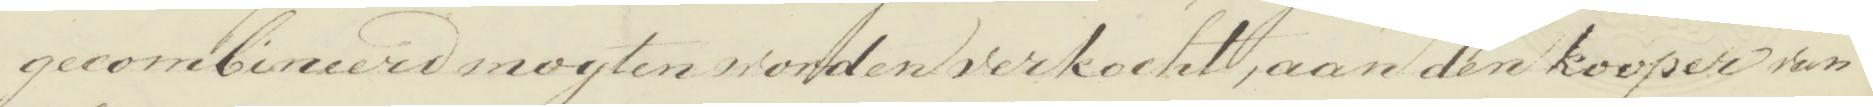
gecombineerd mogten worden verkocht, aan den kooper van
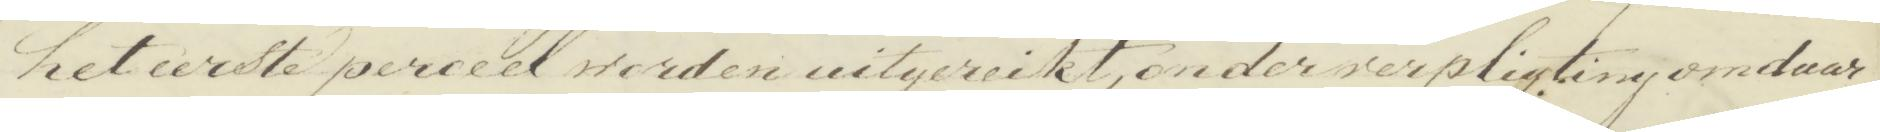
het eerste perceel worden uitgereikt, onder verpligting om daar
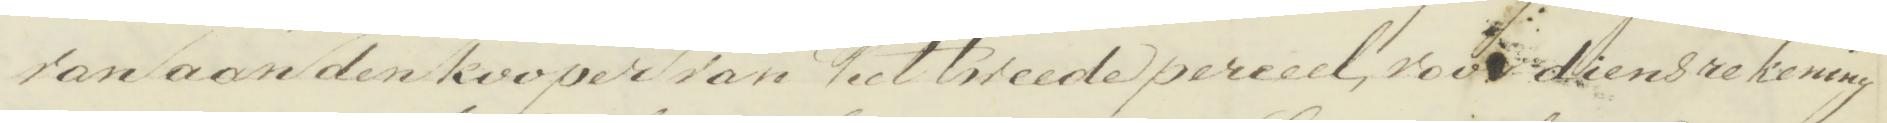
van aan den kooper van het tweede perceel, voor diens rekenng
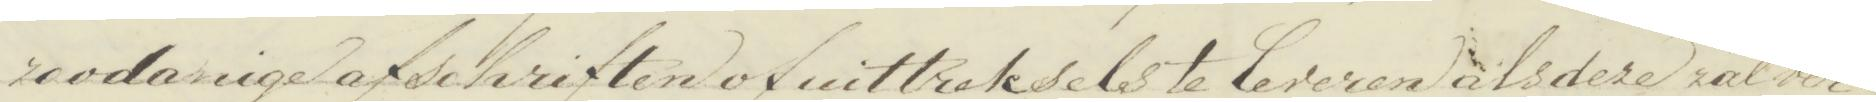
zoodanige afschriften of uittreksels te leveren als deze zal ver
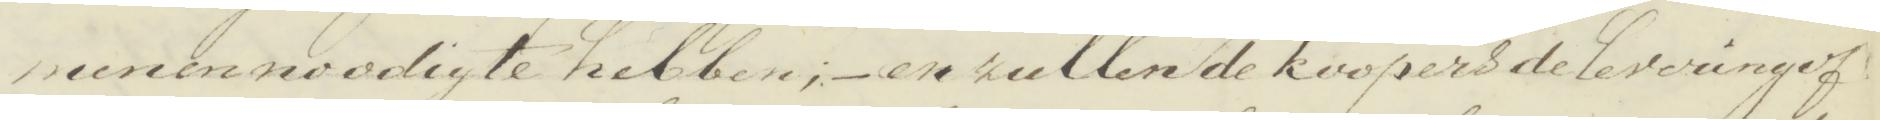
meenen noodig te hebben;- en zullen de koopers de levering of
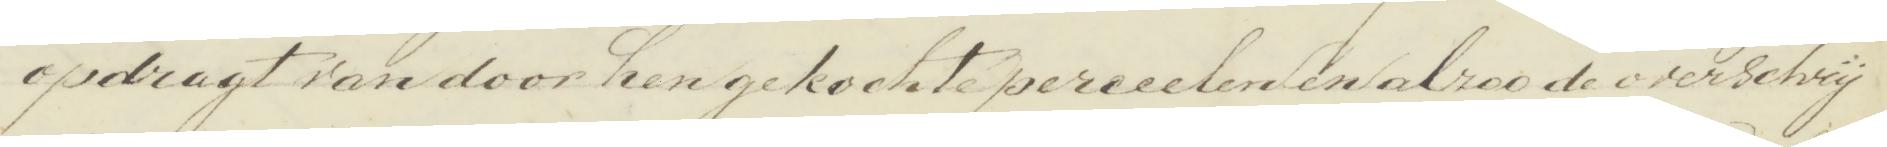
opdragt van door hen gekochte perceelen en alzoo de overschrij
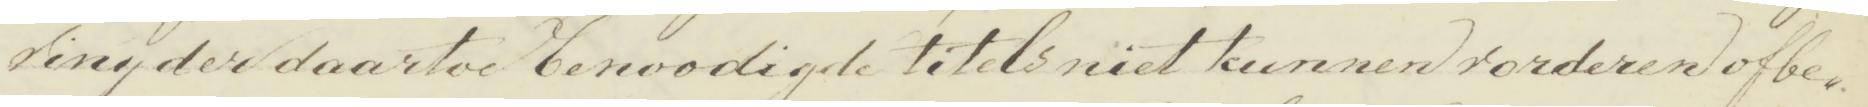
ving der daartoe benoodigde titels niet kunnen vorderen of be„
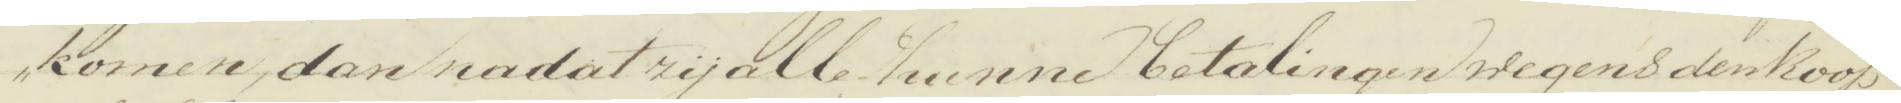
„komen, dan nadat zij alle hunne betalingen wegens den Koop
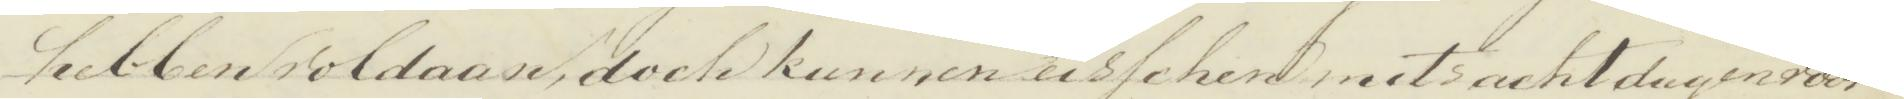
hebben voldaan, doch kunnen eisschen mits acht dagen voor
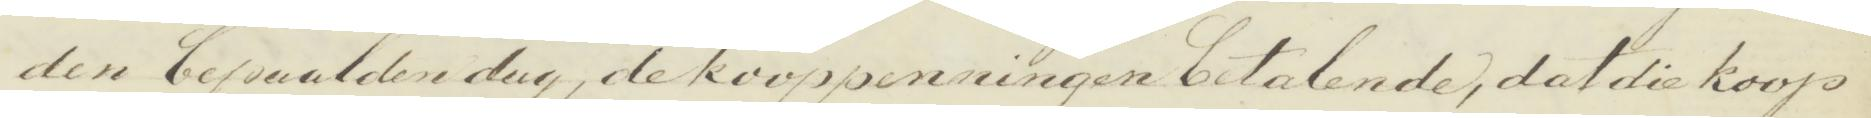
den bepaalden dag, de kooppenningen betalende, dat die koop
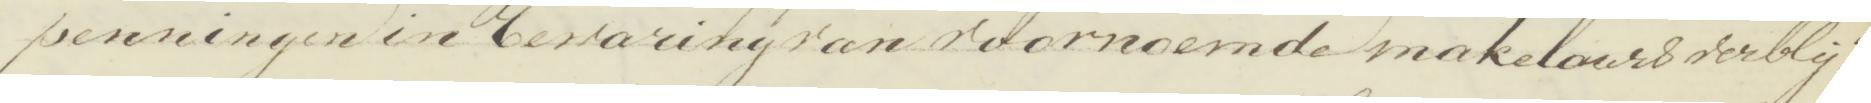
penningen in bewaring van voornoemde makelaars verblij„
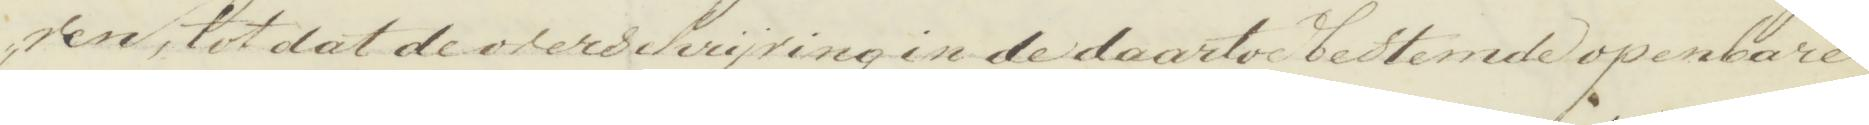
„ven, tot dat de overschrijving in de daartoe bestemde openbare
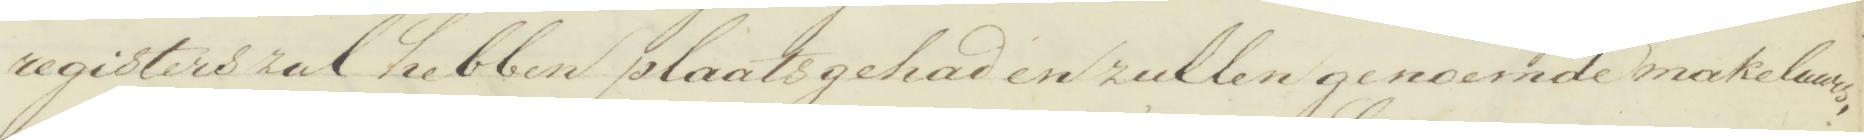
registers zal hebben plaatsgehad en zullen genoemde makelaars,
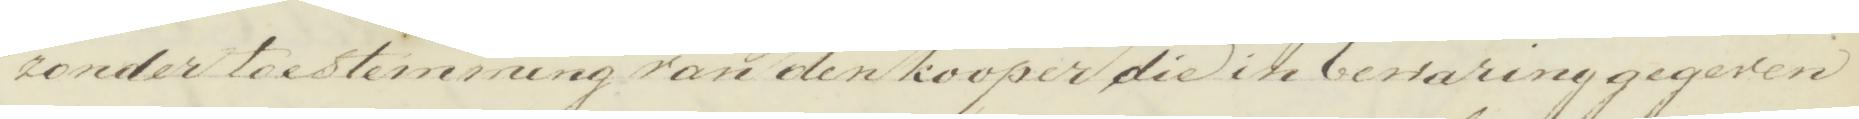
zonder toestemming van den kooper die in bewaring gegeven
